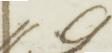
„ 9
